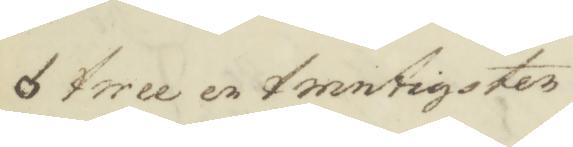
¶ twee en twintigsten
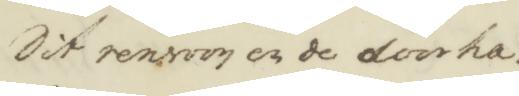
Dit renvooy en de doorha
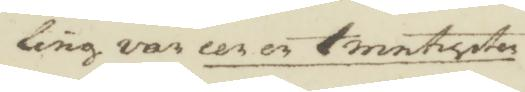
ling van een en twintigsten
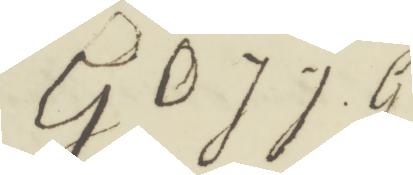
G O J J G
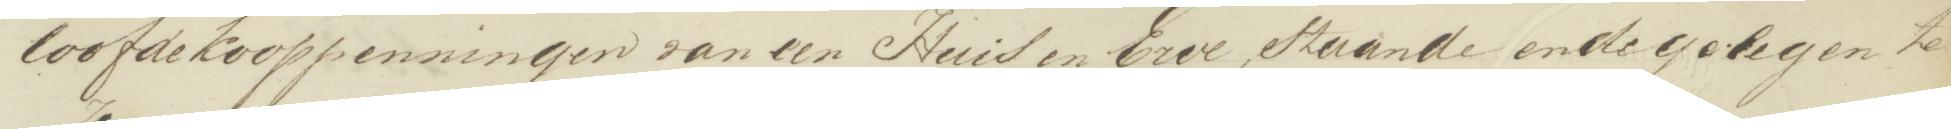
loofde kooppenningen van een Huis en Erve, staande ende gelegen te
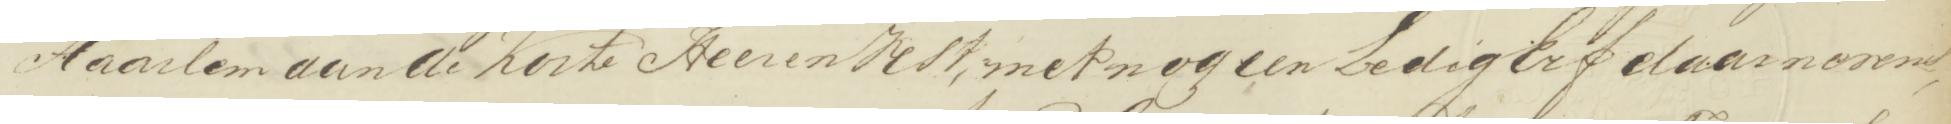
Haarlem aan de Korte Heeren Vest, met nog een Ledig Erf daarnevens,
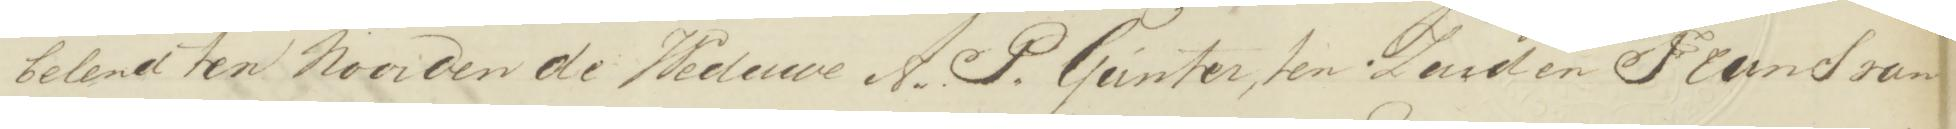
belend ten Noorden de Weduwe A. P. Gunter, ten Zuiden Frans van
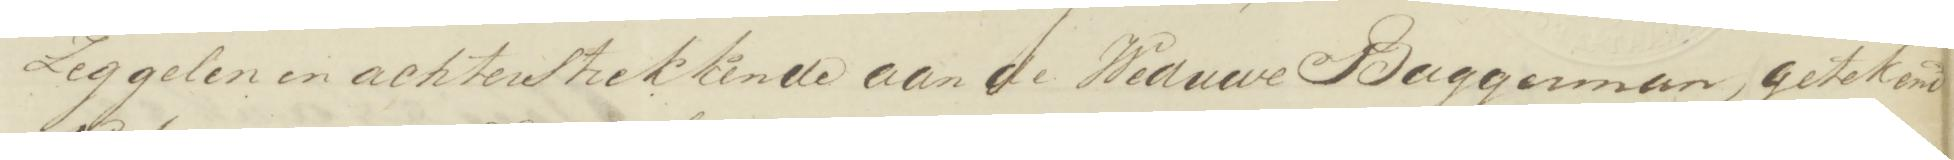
Zeggelen en achterstrekkende aan de Weduwe Baggerman, getekend
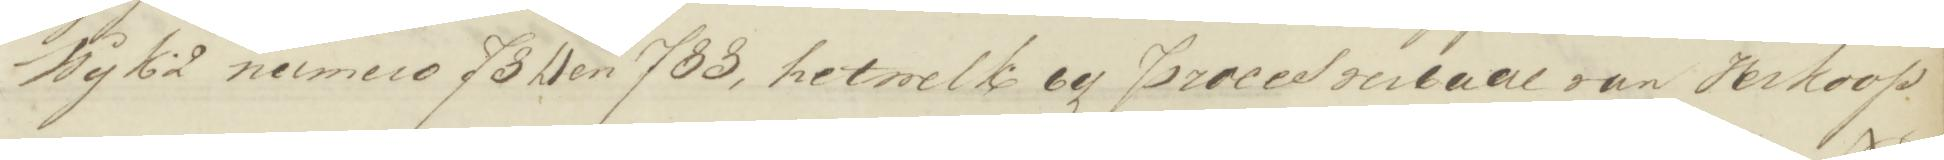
Wyk 2 numero 734en 783, hetwelk by proces verbaal van Verkoop
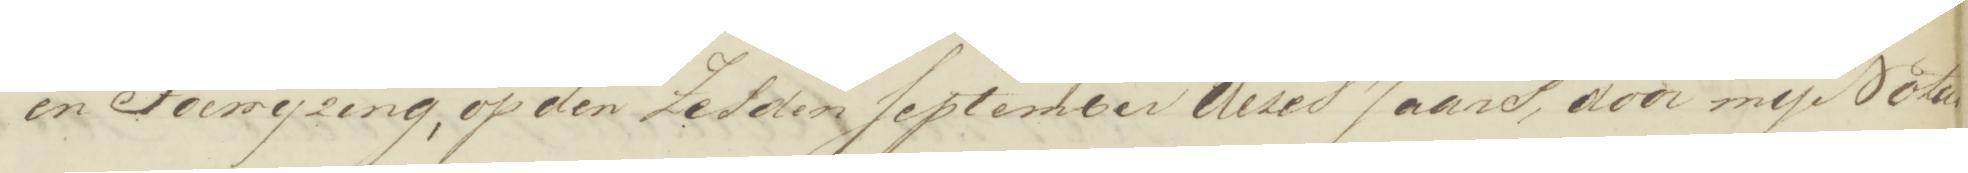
en Toewijzing, op den Zesden september dezes Jaars, door my Nota
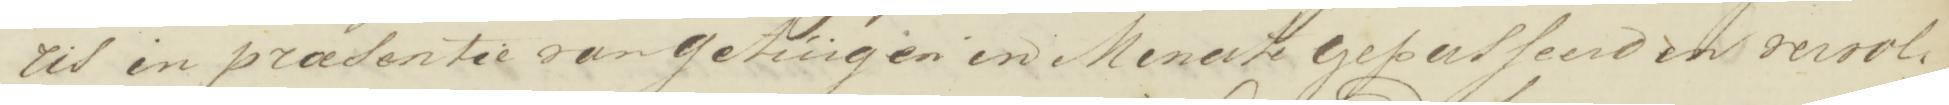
ris in praesentie van getuigen in Minute gepasseerd en vervol„
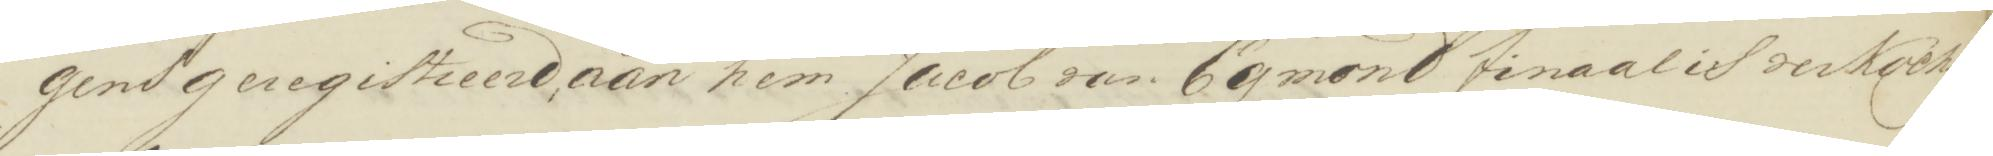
gens geregistreerd, aan hem Jacob van Egmond finaal is verkocht
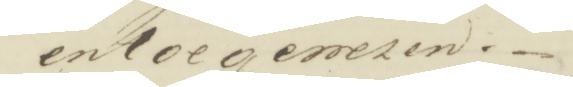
en toegewezen.-
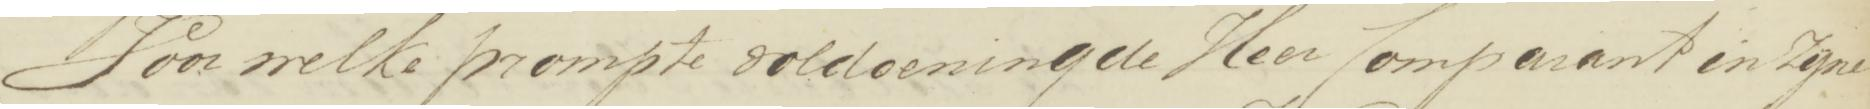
Voor welke prompte voldoening de Heer Comparant in zijne
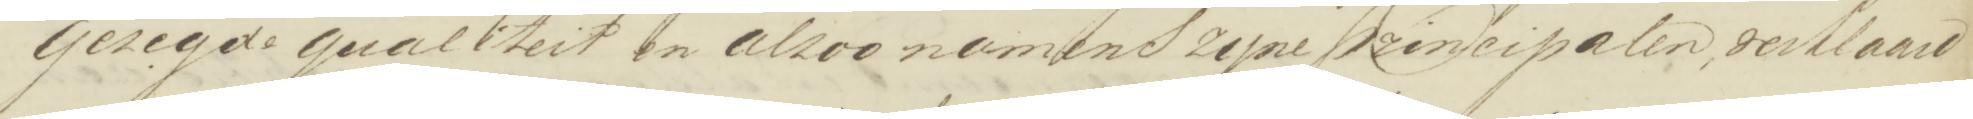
gezegde qualiteit en alzoo namens zyne principalen, verklaard
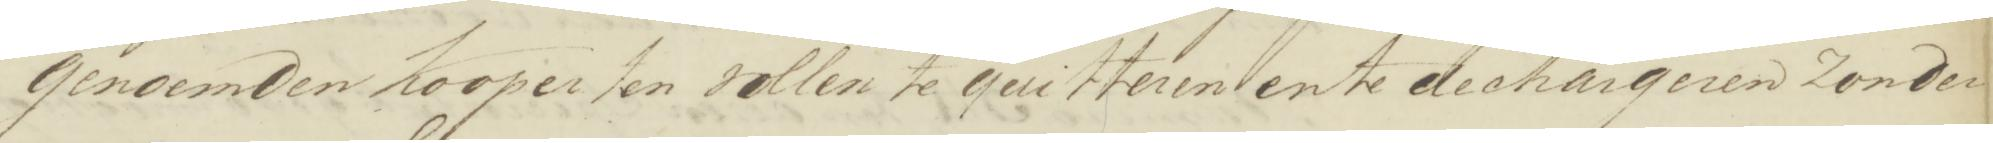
genoemden kooper ten vollen te quitteren en te dechargeren zonder
